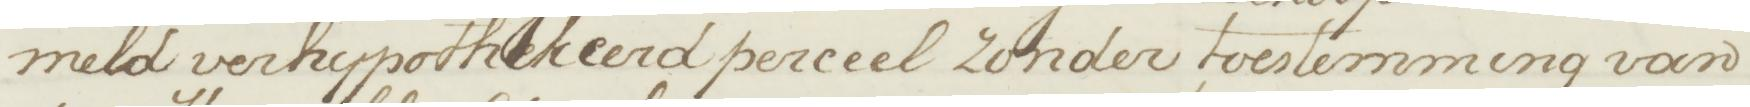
meld verhypothekeerd perceel zonder toestemming van
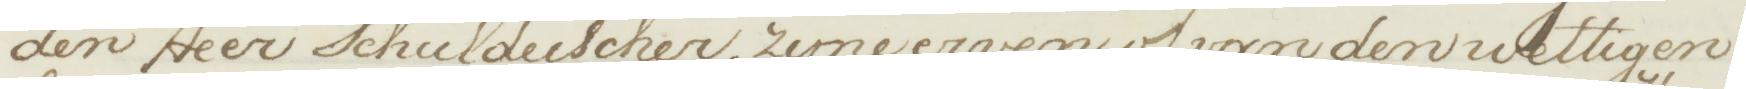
den Heer Schuldeischer, zyne erven of van den wettigen
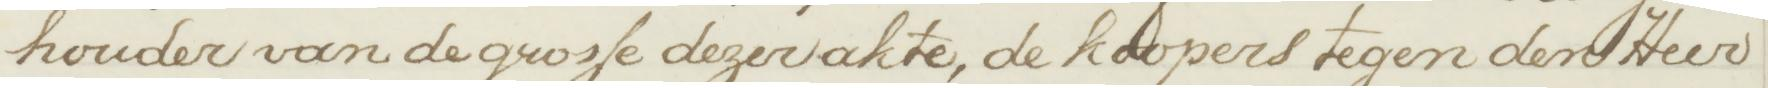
houder van de grosse dezerakte, de koopers tegen den Heer
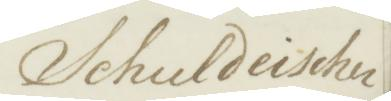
Schuldeischer
